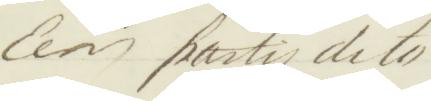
Een partij dito
